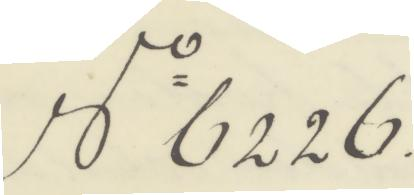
N=o 6226
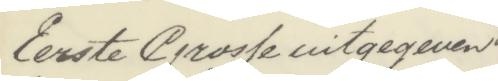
Eerste Grosse uitgegeven
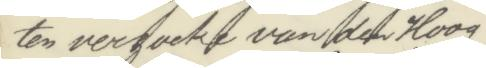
ten verzoeke van den Hoog
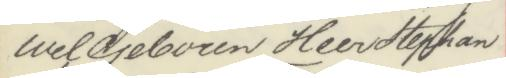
wel Geboren Heer Stephan
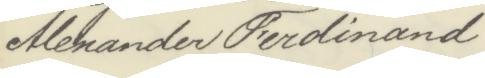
Alexander Ferdinand
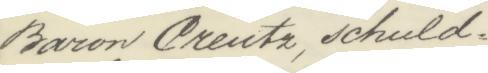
Baron Creutz, schuld
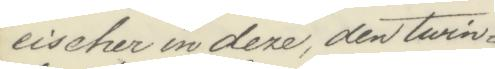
eischer in deze, den twin
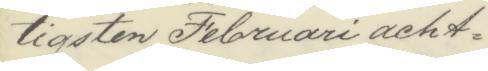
tigsten Februari acht=
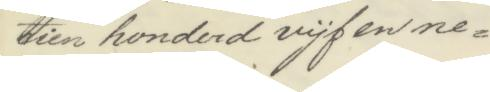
tien honderd vijf en ne=
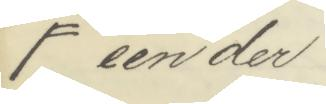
¶ een der
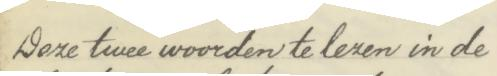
Deze twee woorden te lezen in de
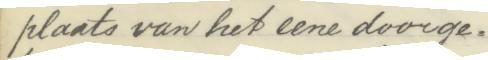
plaats van het eene door ge
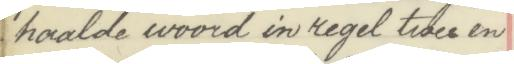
haalde woord in regel twee en
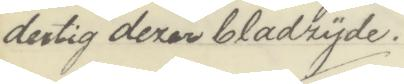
dertig dezer bladzijde
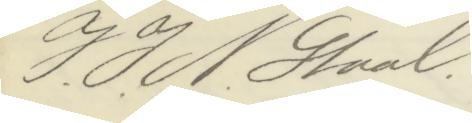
J.J.N. Staal.
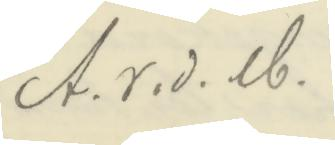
A. v. d. M.
